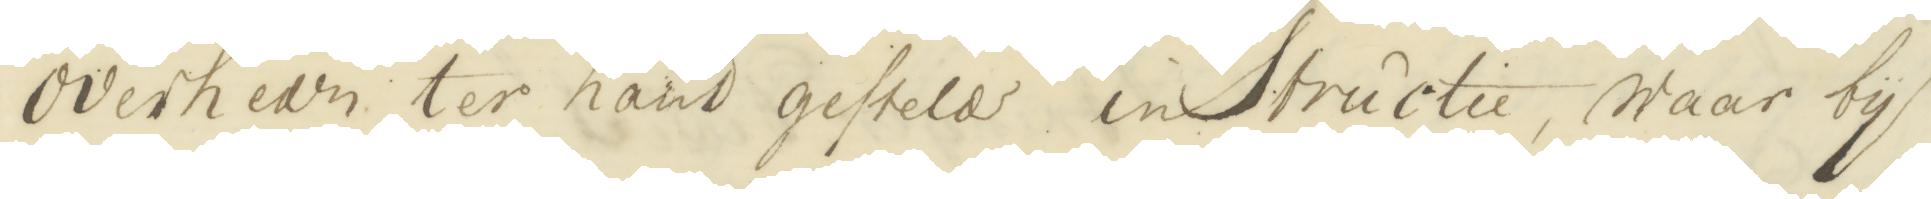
overheden ter hand gestelde instructie, waar bij
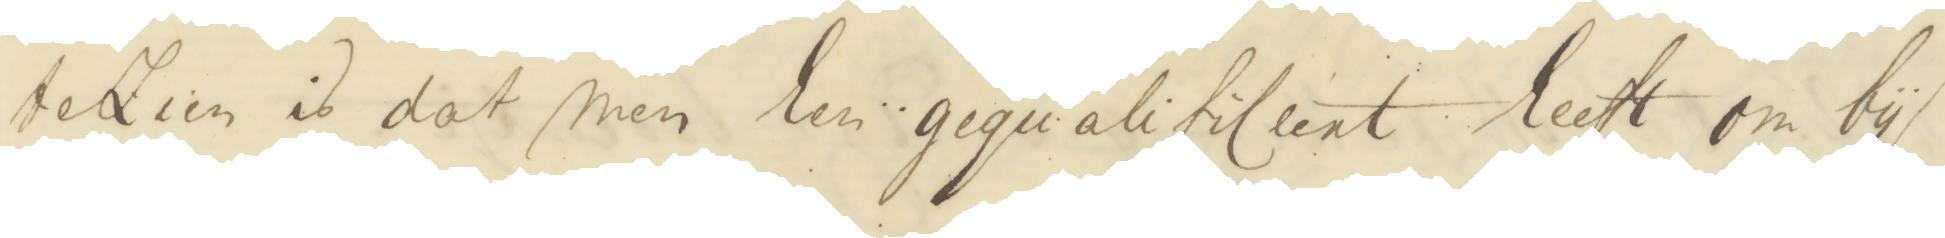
te Zien is dat men hen gequalificeert heeft om bij
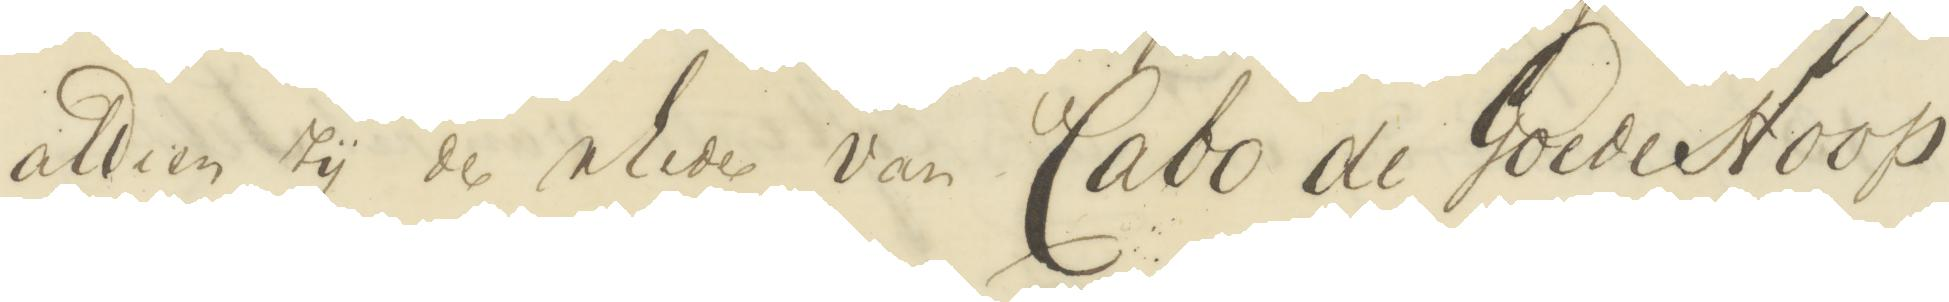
aldien zij de rhede van Cabo de Goede Hoop
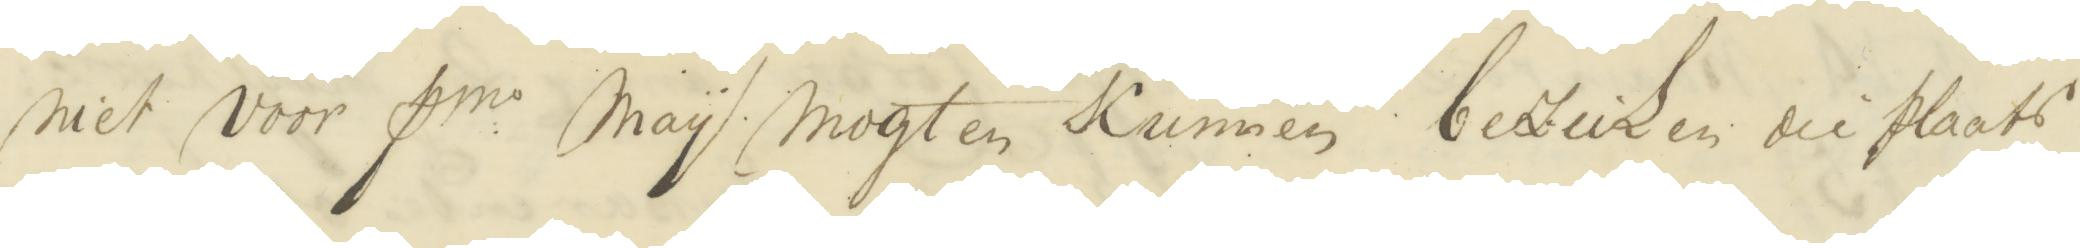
niet voor p:mo maij mogten kunnen bezeilen die plaats
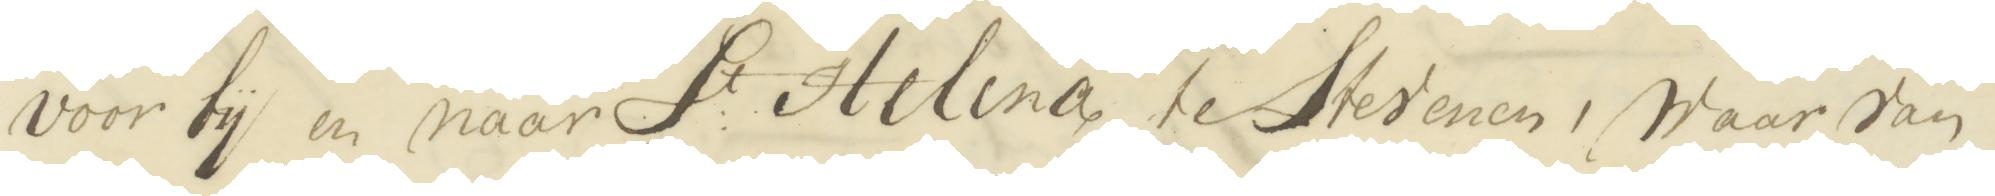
voorbij en naar S:t Helena te Stevenen, waarvan
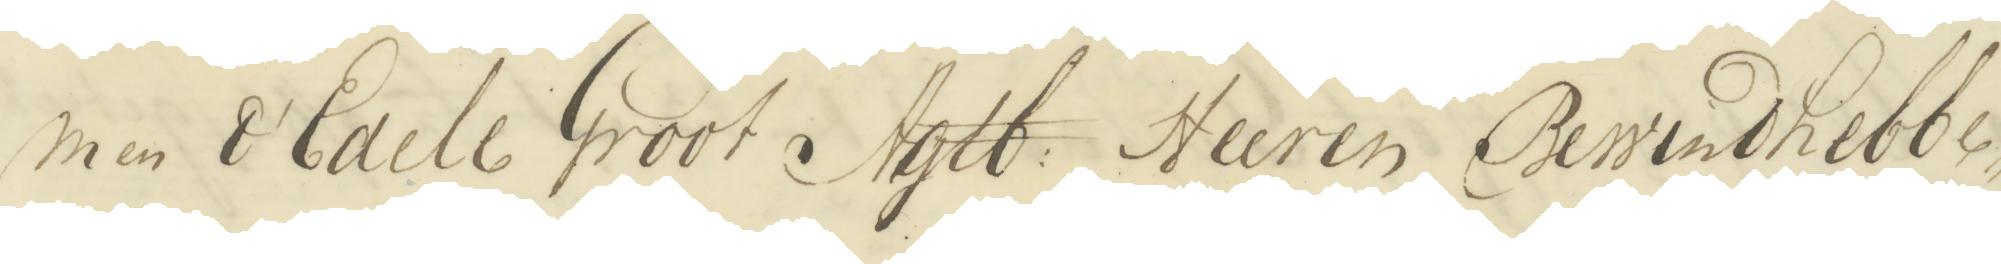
men d’ Edele Groot Agtb: Heeren Bewindhebbe„
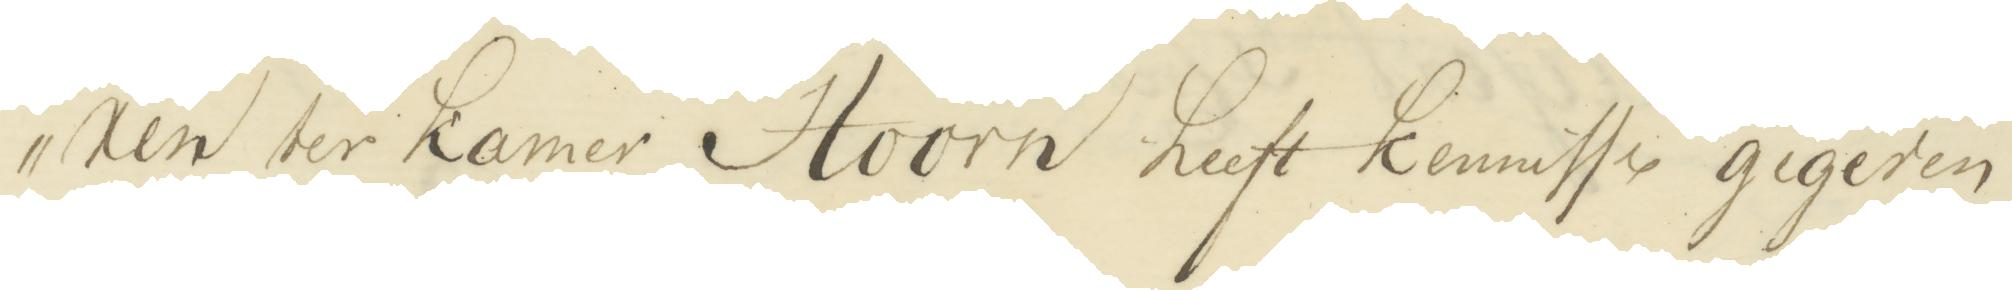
„ren ter kamer Hoorn heeft kennisse gegeven
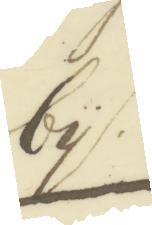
bij.
